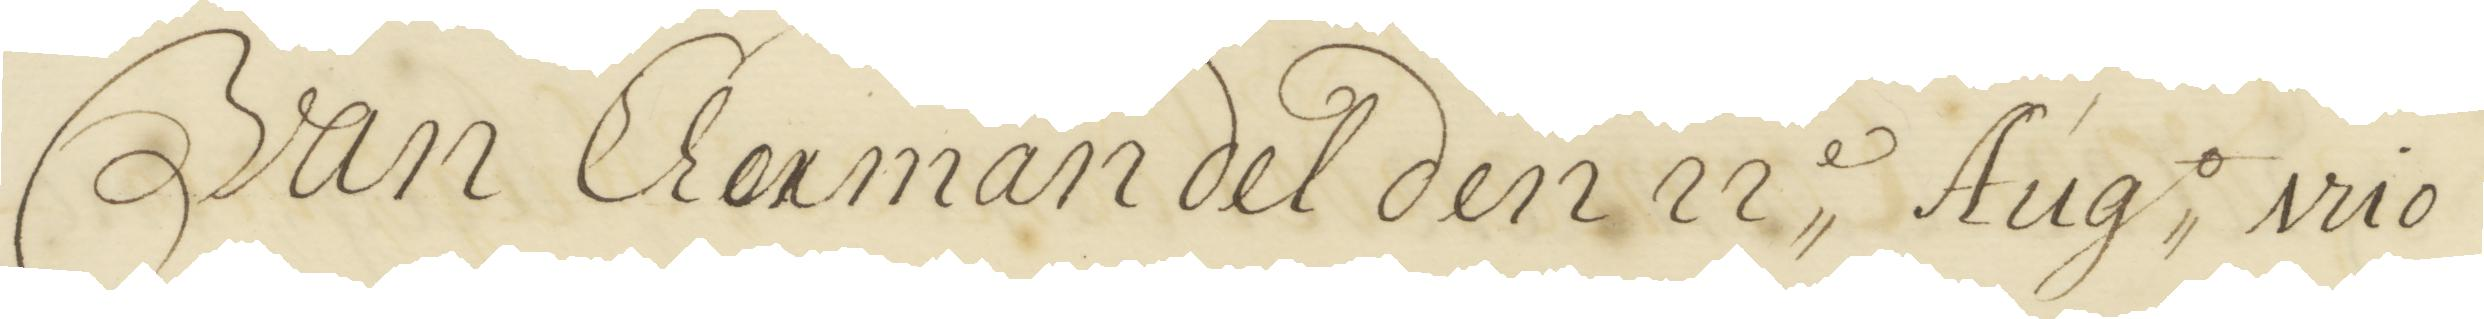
Van Chorman del den 22„e Aug„o 1710
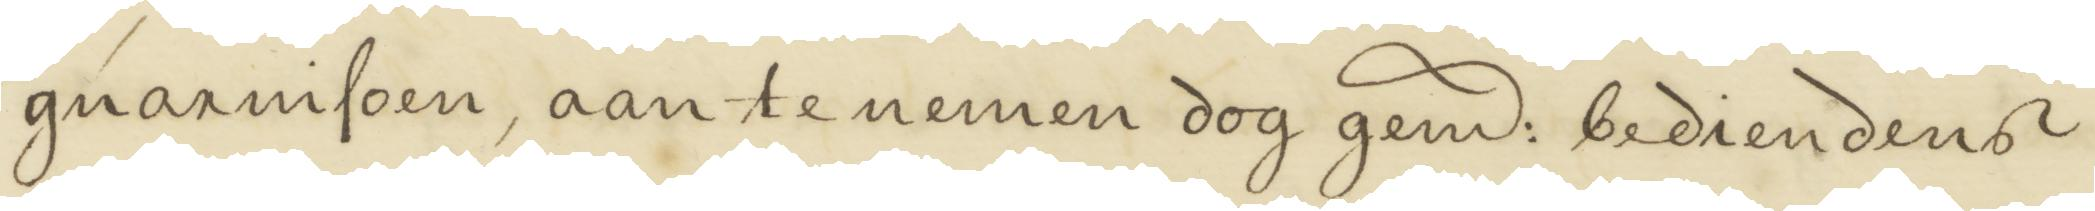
guarnisoen, aan te nemen dog gem: bediendens
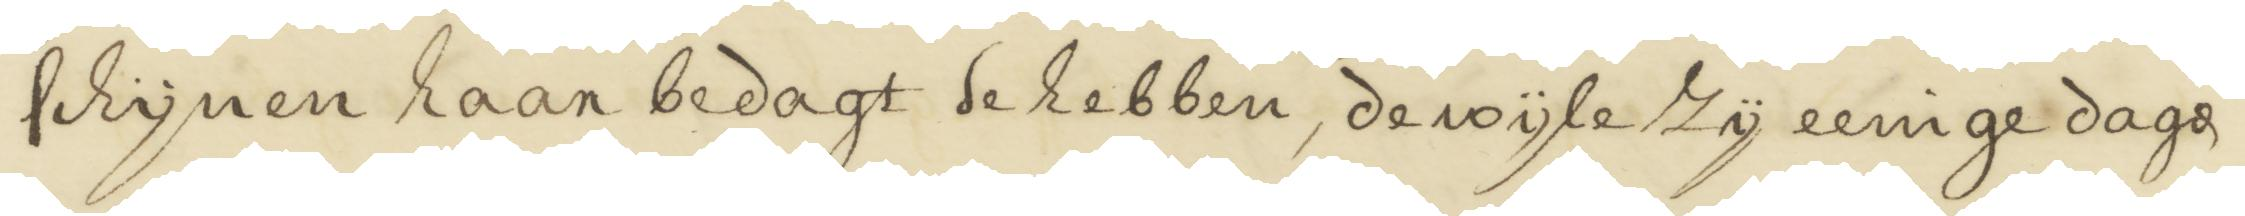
schijnen haar bedagt te hebben, de wijle zij eenige dagen
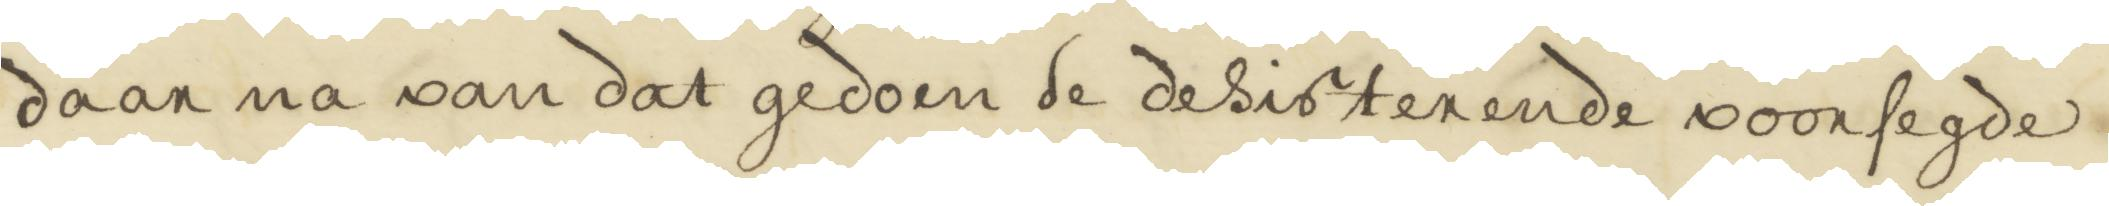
daar na van dat gedoen te desisterende voorsegde
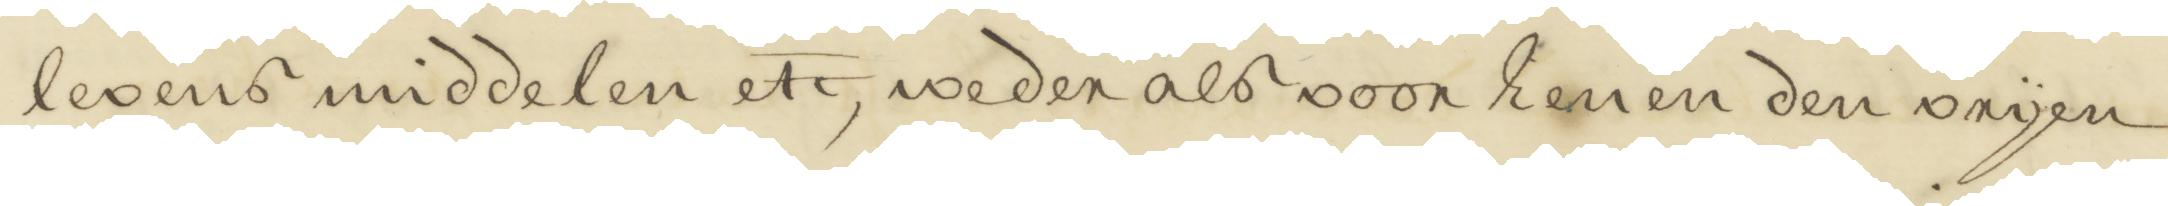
levens middelen etc, weder als voor hen en den vrijen
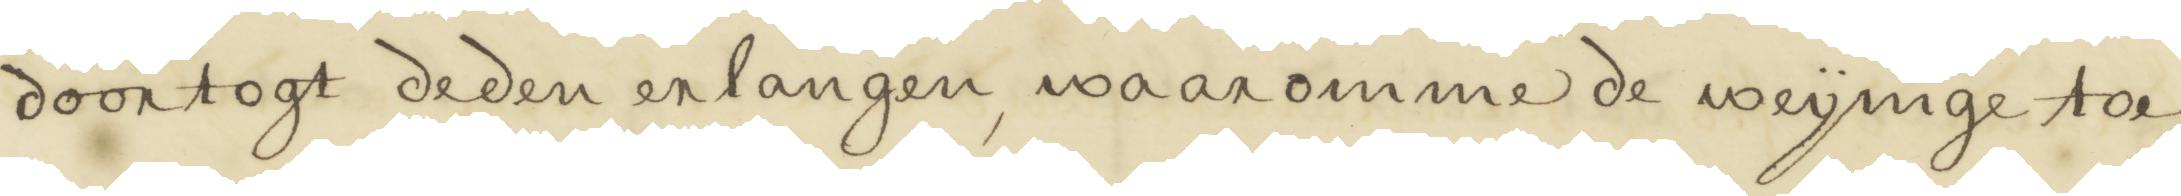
door togt deden erlangen, waar omme de weijnige toe
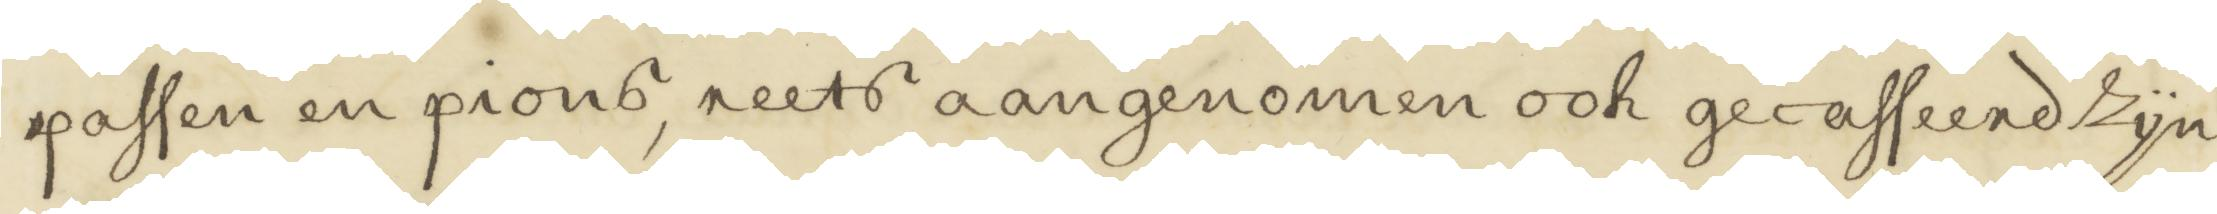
passen en pions, reets aangenomen ook gecasseerd zijn
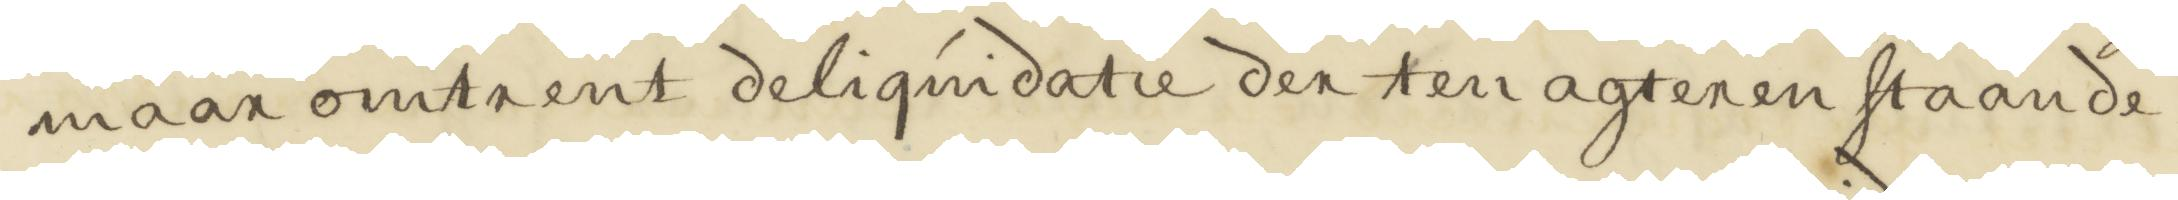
maar omtrent deliquidatie der ten agteren staande
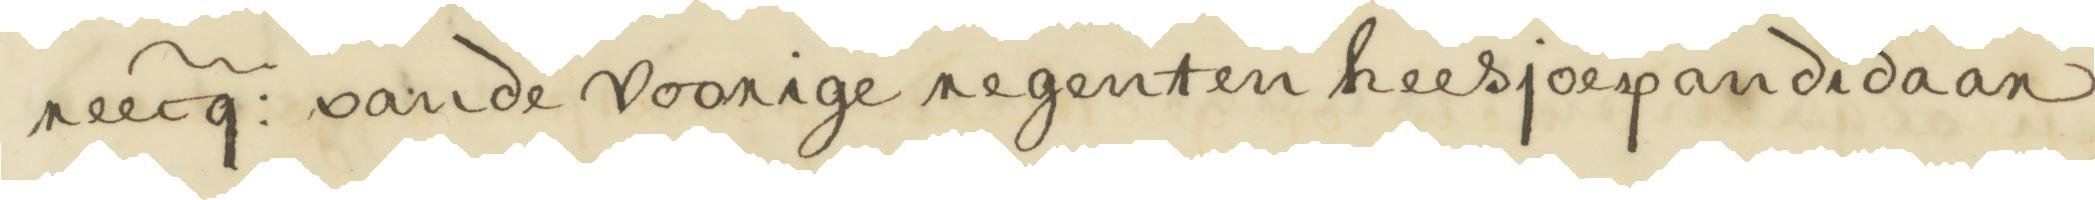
reecq: van de voorige regenten heesjoepandidaar
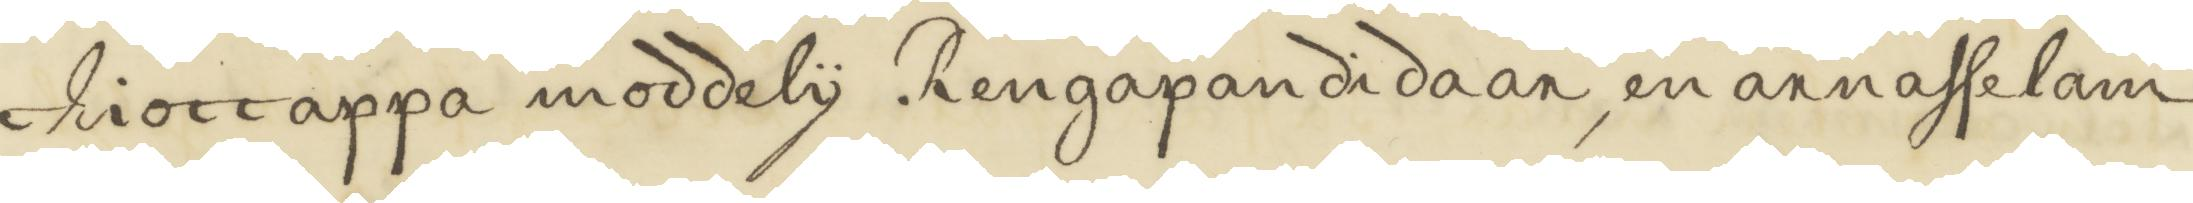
chioccappa moddelij Rengapandidaar, en arnasselam
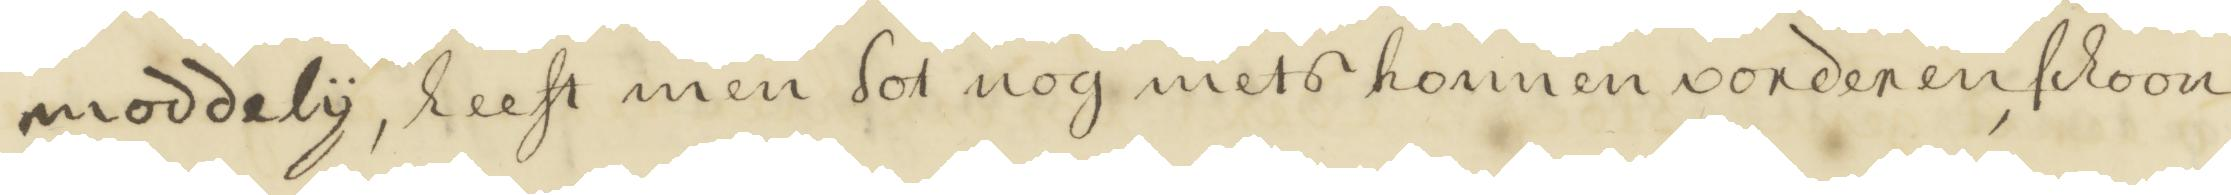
moddelij, heeft men tot nog niets konnen vorderen, schoon
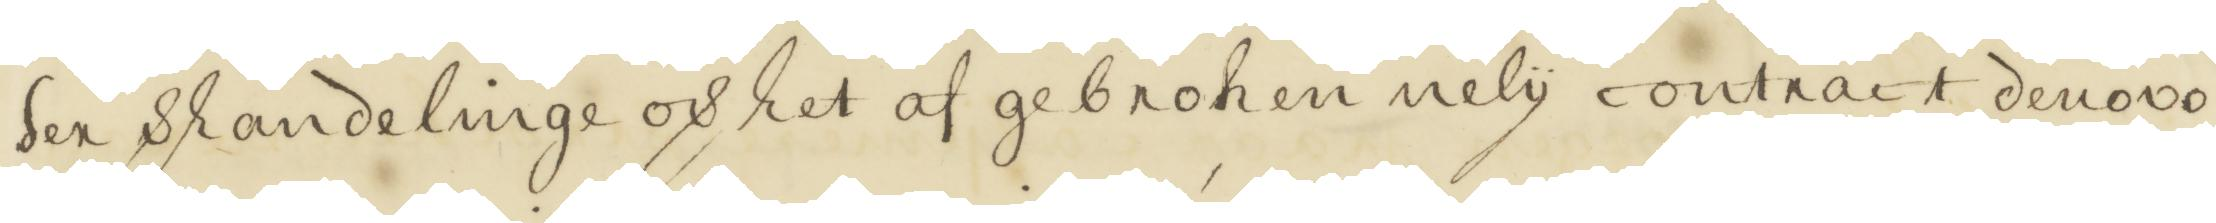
ter verhandelinge over het af gebroken nelij contract, denovo
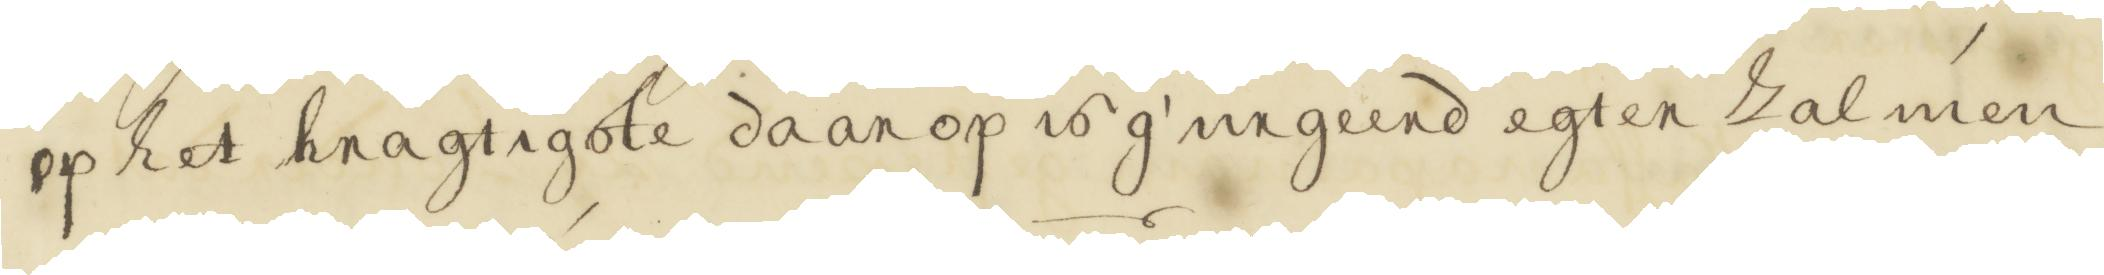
op het kragtigste daar op is g’urgeerd egter zal men
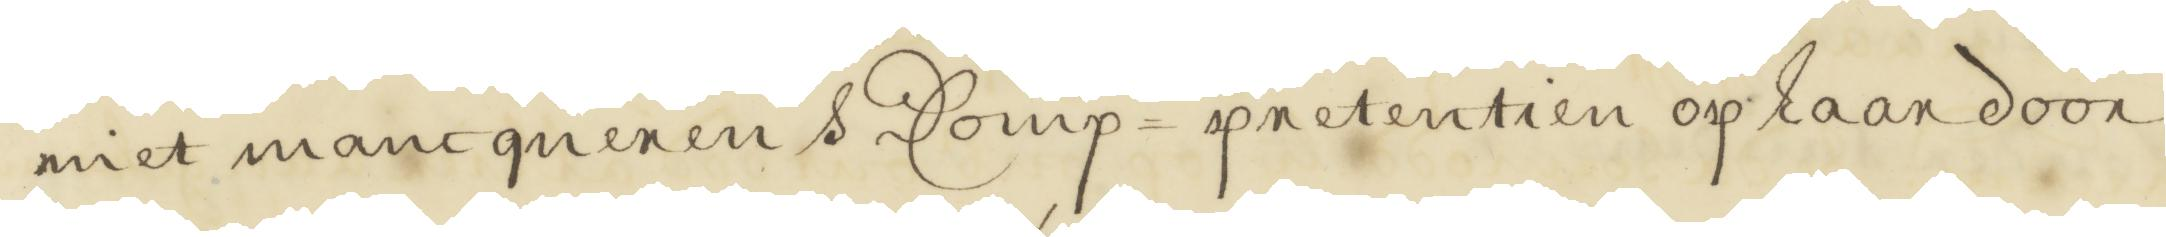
niet mancqueren s Comp=s pretentien op haar door
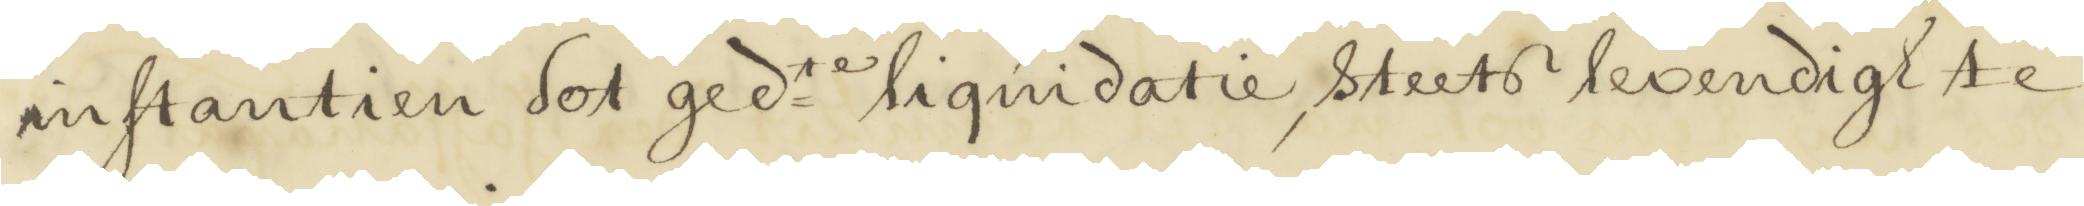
instantien tot ged=te liquidatie, steets levendigh te
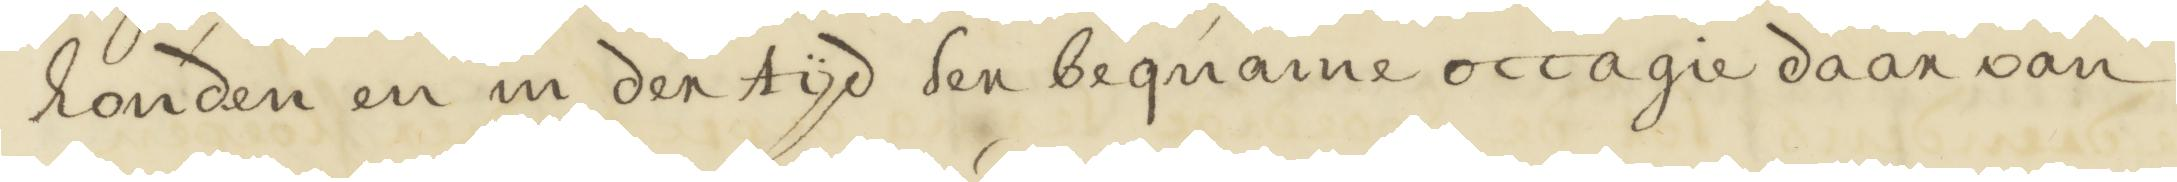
houden en in der tijd ter bequame occagie daar van
